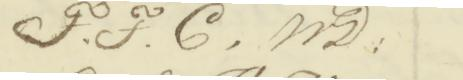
T.T.C, WD:
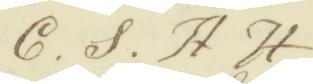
C.S. A H
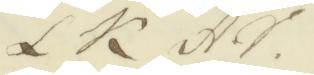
L K AV
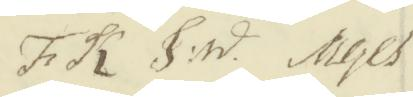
FK S:W. Mgls
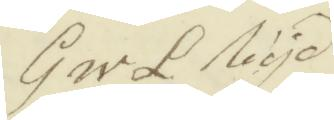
GwL tijd
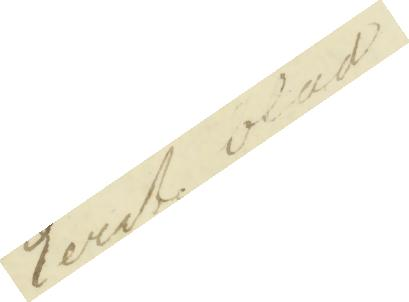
Eerst blad
